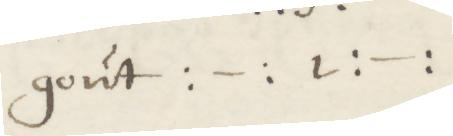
gout : — : 2 : — :
